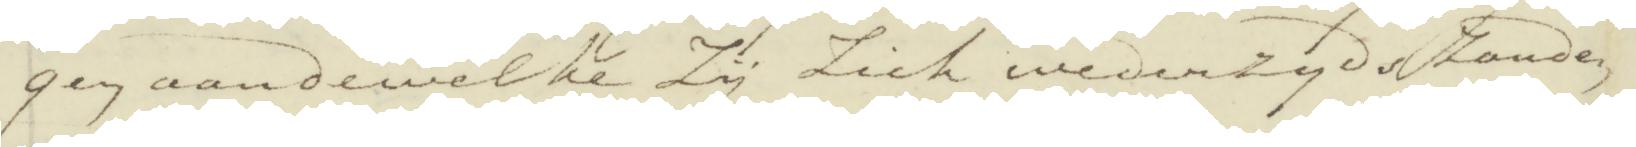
gen aan dewelke zij zich wederzyds zouden
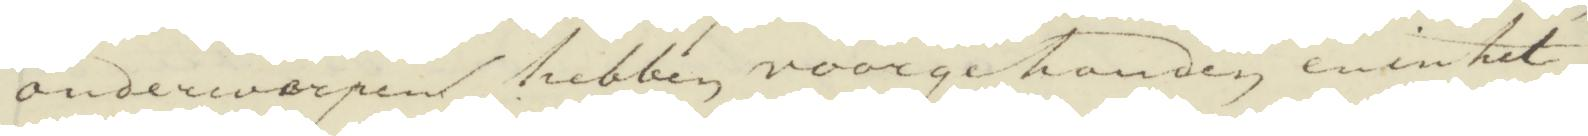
onderworpen hebben voorgehouden en in het
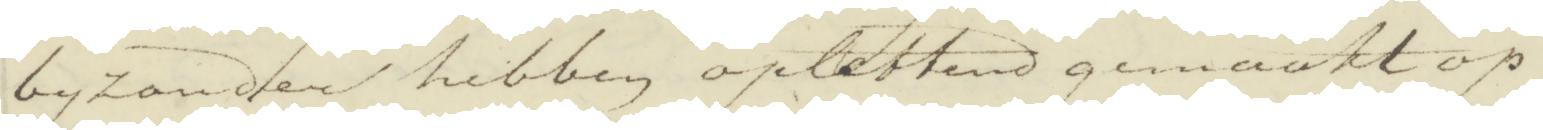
byzonder hebben oplettend gemaakt op
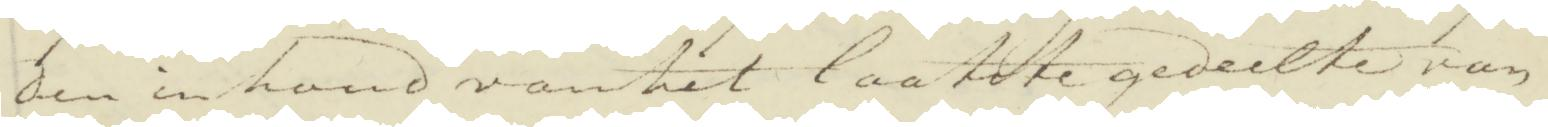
den inhoud van het laatste gedeelte van
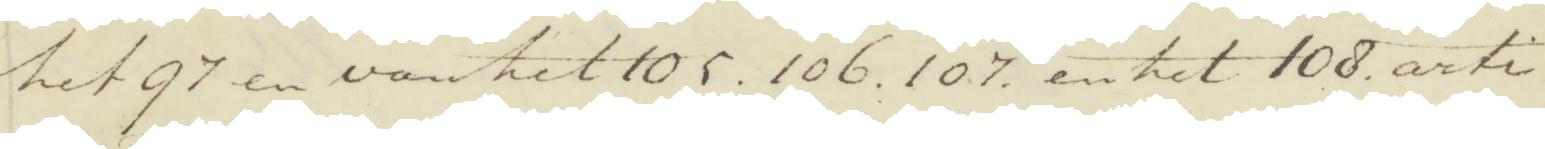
het 97 en van het 105. 106. 107. en het 108. arti
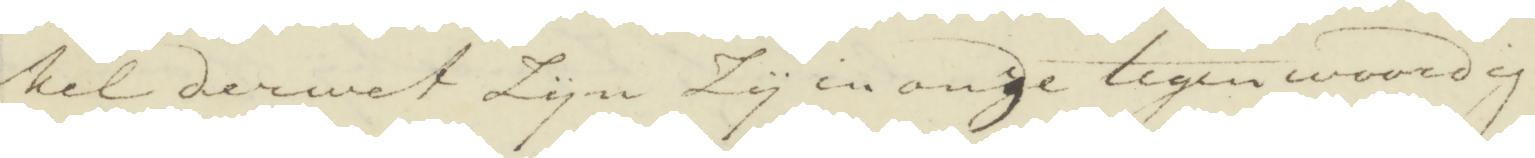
kel derwet zijn zij in onze tegenwoordig
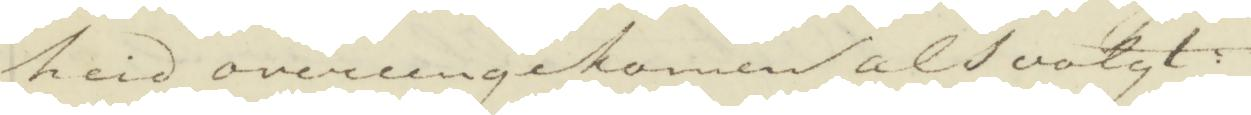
heid overeengekomen als volgt:
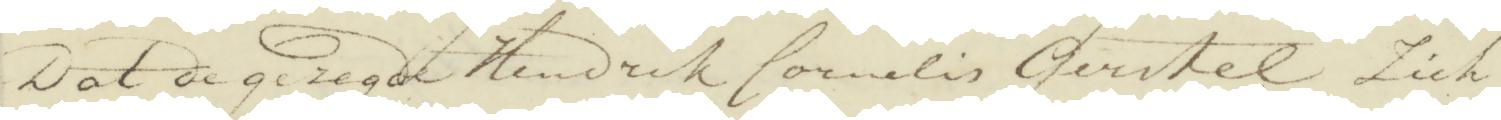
Dat de gezegde Hendrik Cornelis Gerstel zich
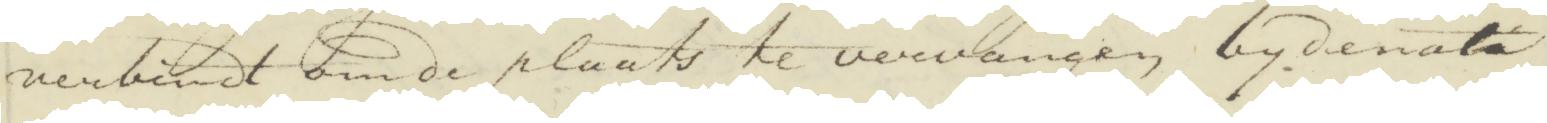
verbindt omde plaats te vervangen bij denati
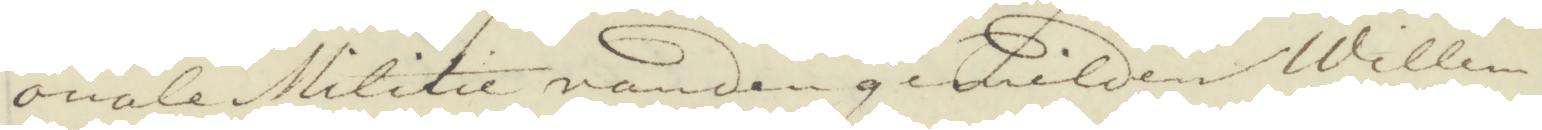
onale Militie van den gemelden Willem
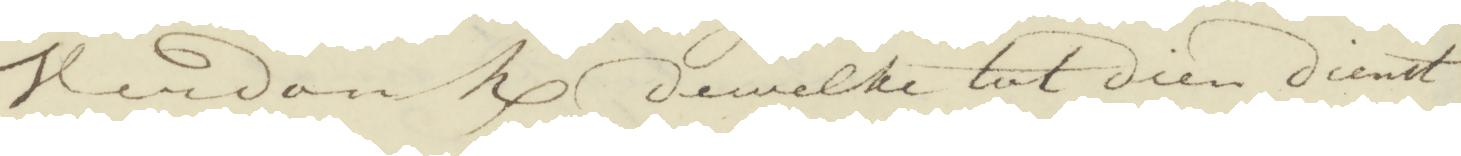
Verdonk dewelke tot dien dienst
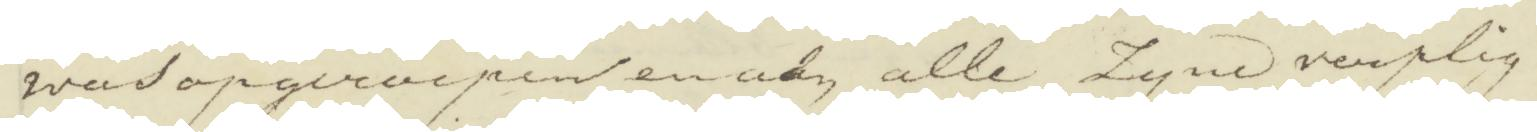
was opgeroepen en aan alle zyne verplig
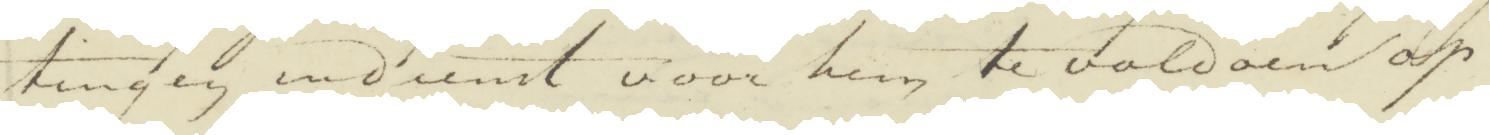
tingen indienst voor hem te voldoen op
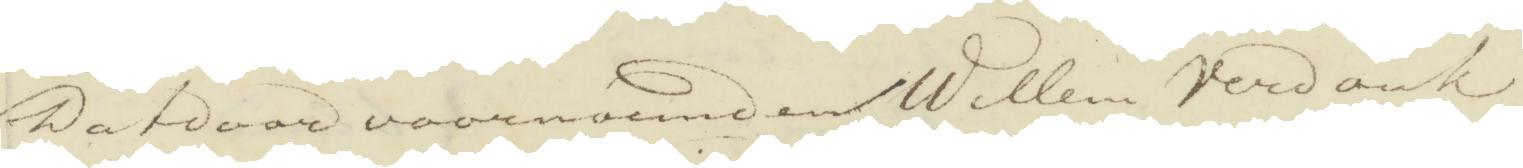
Dat door voornoemden Willem Verdonk
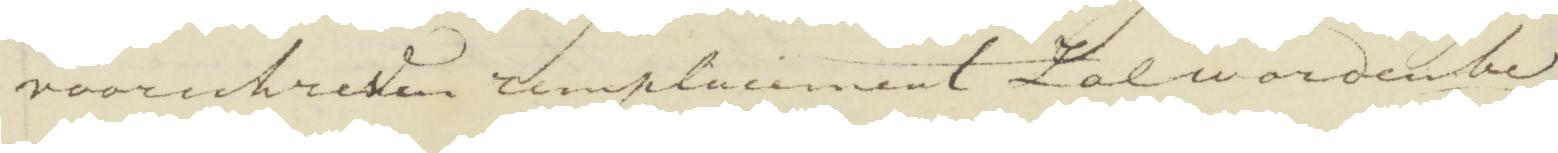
voorschreven remplacement zal wordenbe
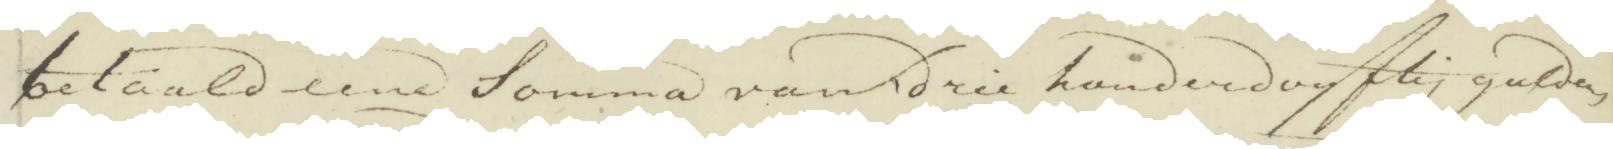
betaald eene somma van drie honderdvyftig gulden
